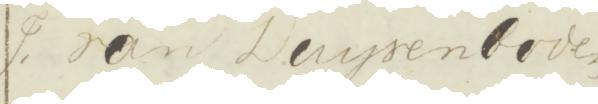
J. van Duyvenboden
